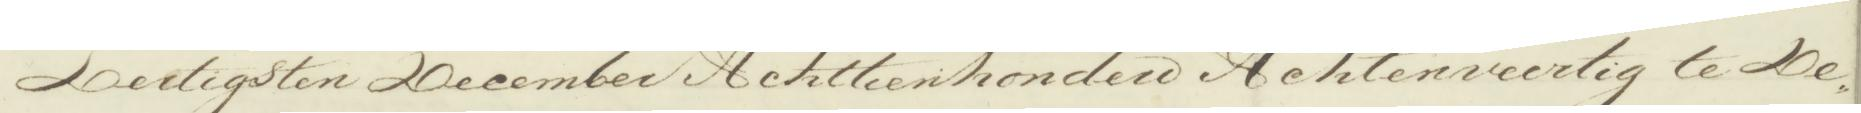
Dertigsten December Achttienhonderd Achtenveertig te De„
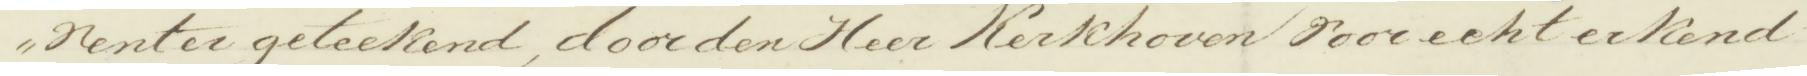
„venter geteekend, door den Heer Kerkhoven voor echt erkend
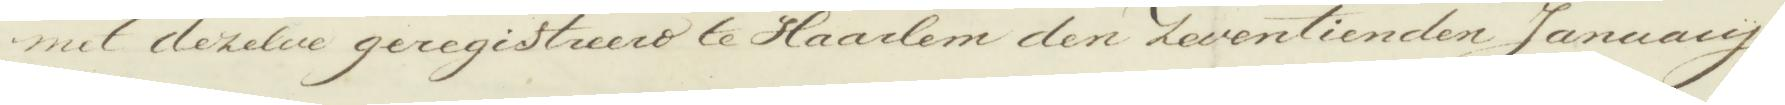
met dezelve geregistreerd te Haarlem den zeventienden Januarij
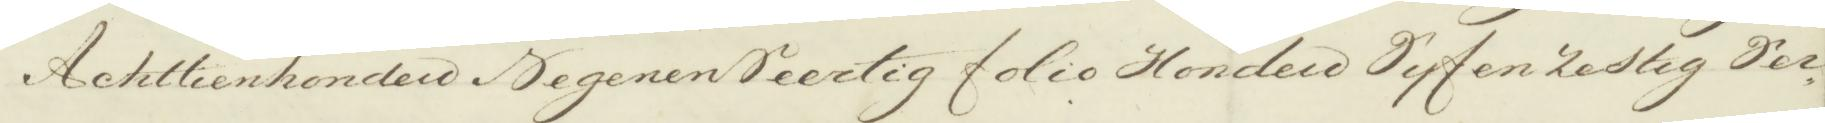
Achttienhonderd Negenen Veertig folio Honderd Vyf en zestig Ver„
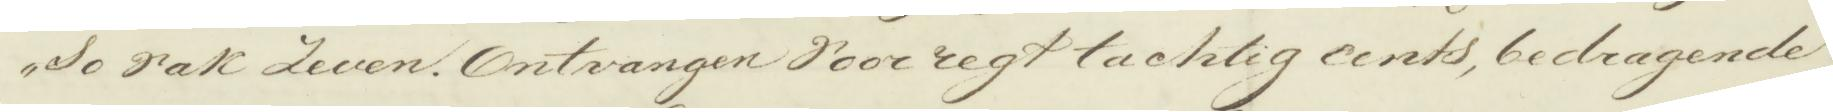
„so vak zeven. Ontvangen voor regt tachtig cents, bedragende
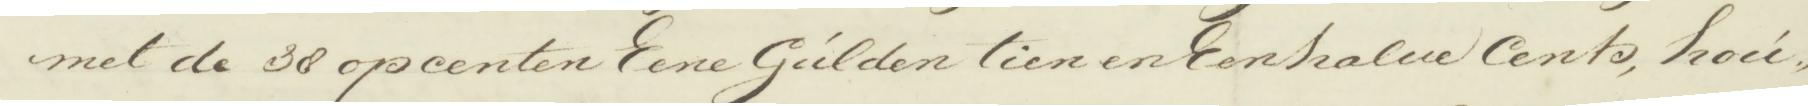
met de 38 opcenten Eene Gulden tien en een halve Cents, hou
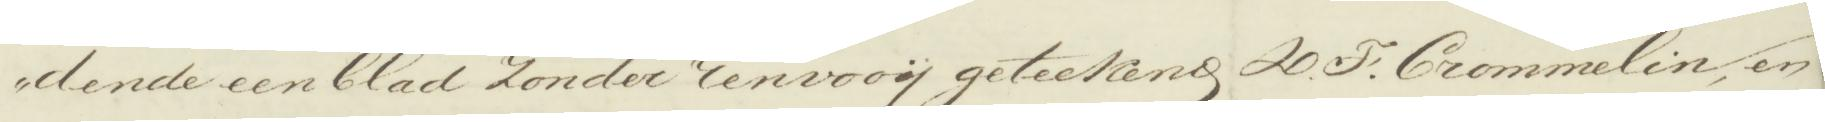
„dende een blad zonder renvooij geteekend D.F. Crommelin, en
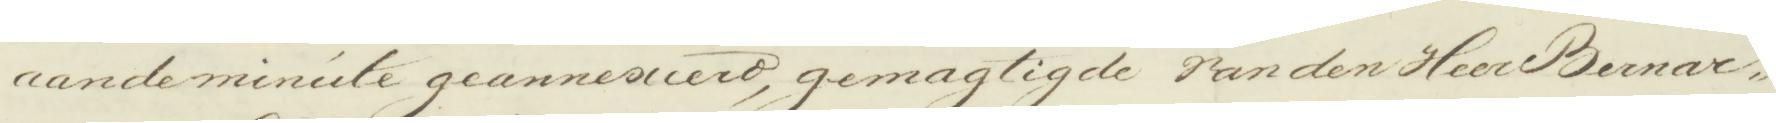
aan de minute geannexeerd, gemagtigde van den Heer Bernar„
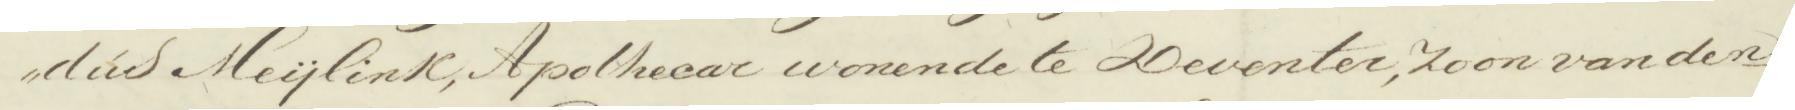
„dus Meijlink, Apothecar wonende te Deventer, zoon van den
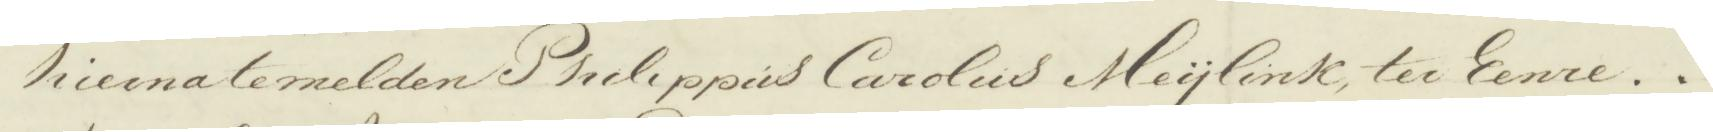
hiernatemelden Philippus Carolus Meijlink, ter Eenre . .
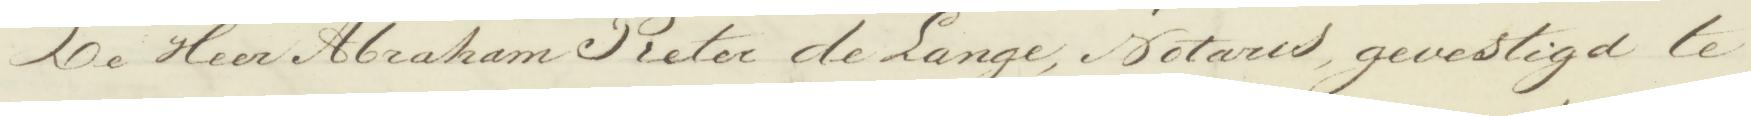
De Heer Abraham Pieter de Lange, Notaris, gevestigd te
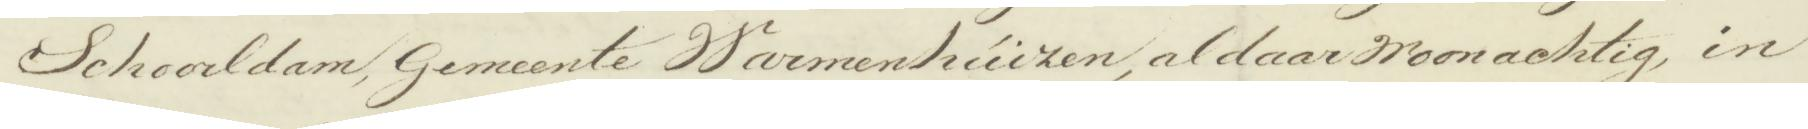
Schoorldam, Gemeente Warmenhuizen, aldaar woonachtig, in
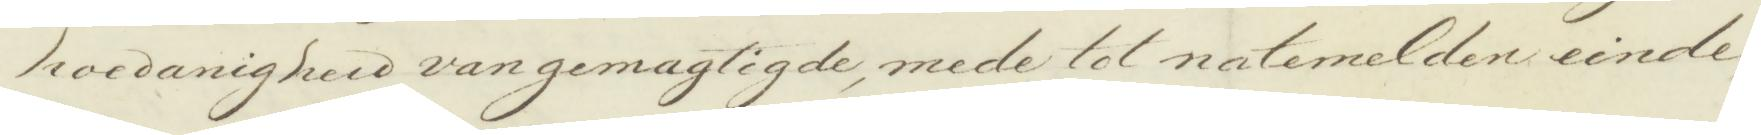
hoedanigheid van gemagtigde, mede tot natemelden einde,
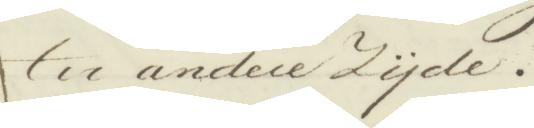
ter andere zijde .
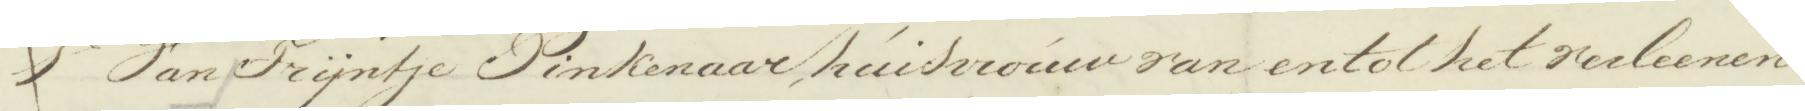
1e Van Trijntje Pinkenaar, huisvrouw van en tot het verleenen
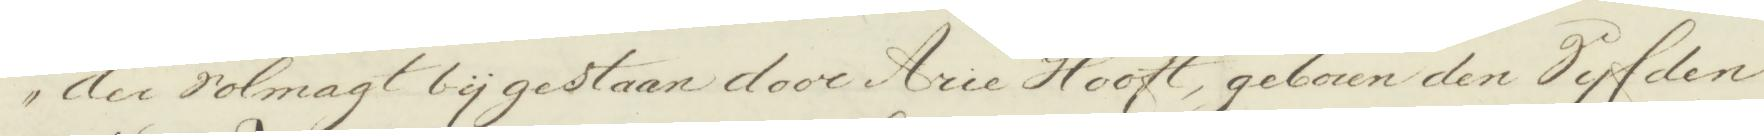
„ der volmagt bijgestaan door Arie Hooft, geboren den Vijfden
